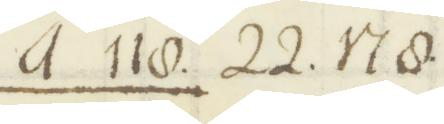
4 118. 22.178
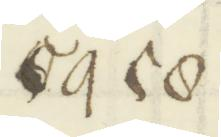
54 58
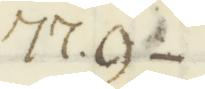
77. 9–
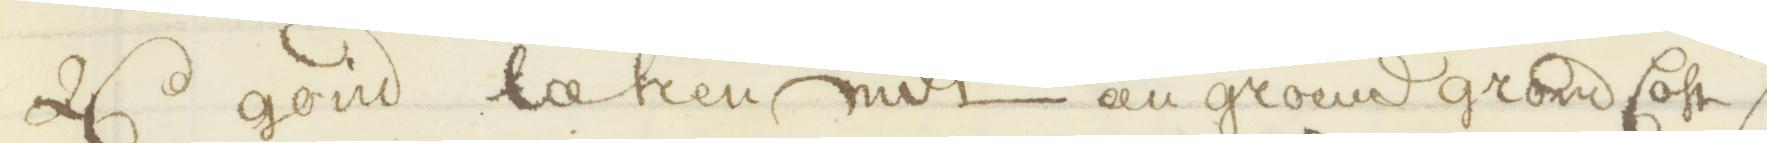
26 goud laken met een groene grond Cost
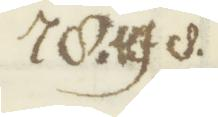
78.19 8.
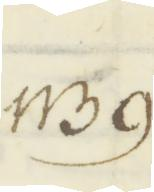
1139 8.
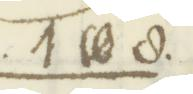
1 10 8.
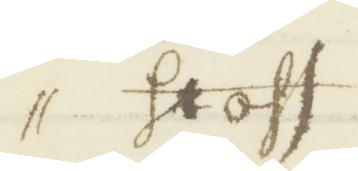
„ stoff
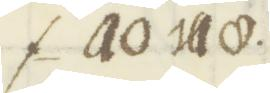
ƒ 40 14 8
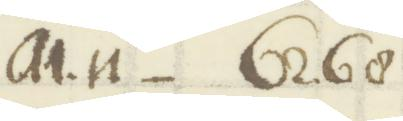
41.11– 62.68
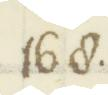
16 8.
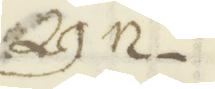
22 12–
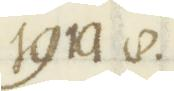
1914 8.
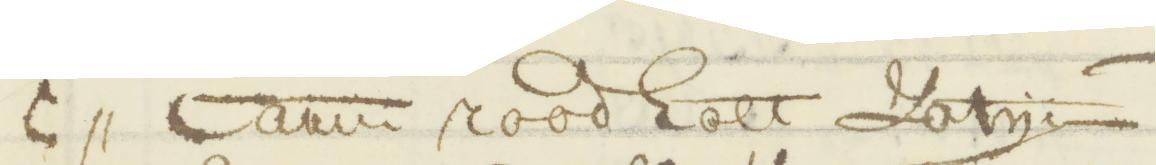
5„ Carm roodholl zatijn
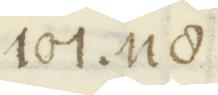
101. 11 8
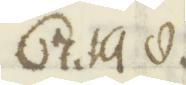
67.14 8
